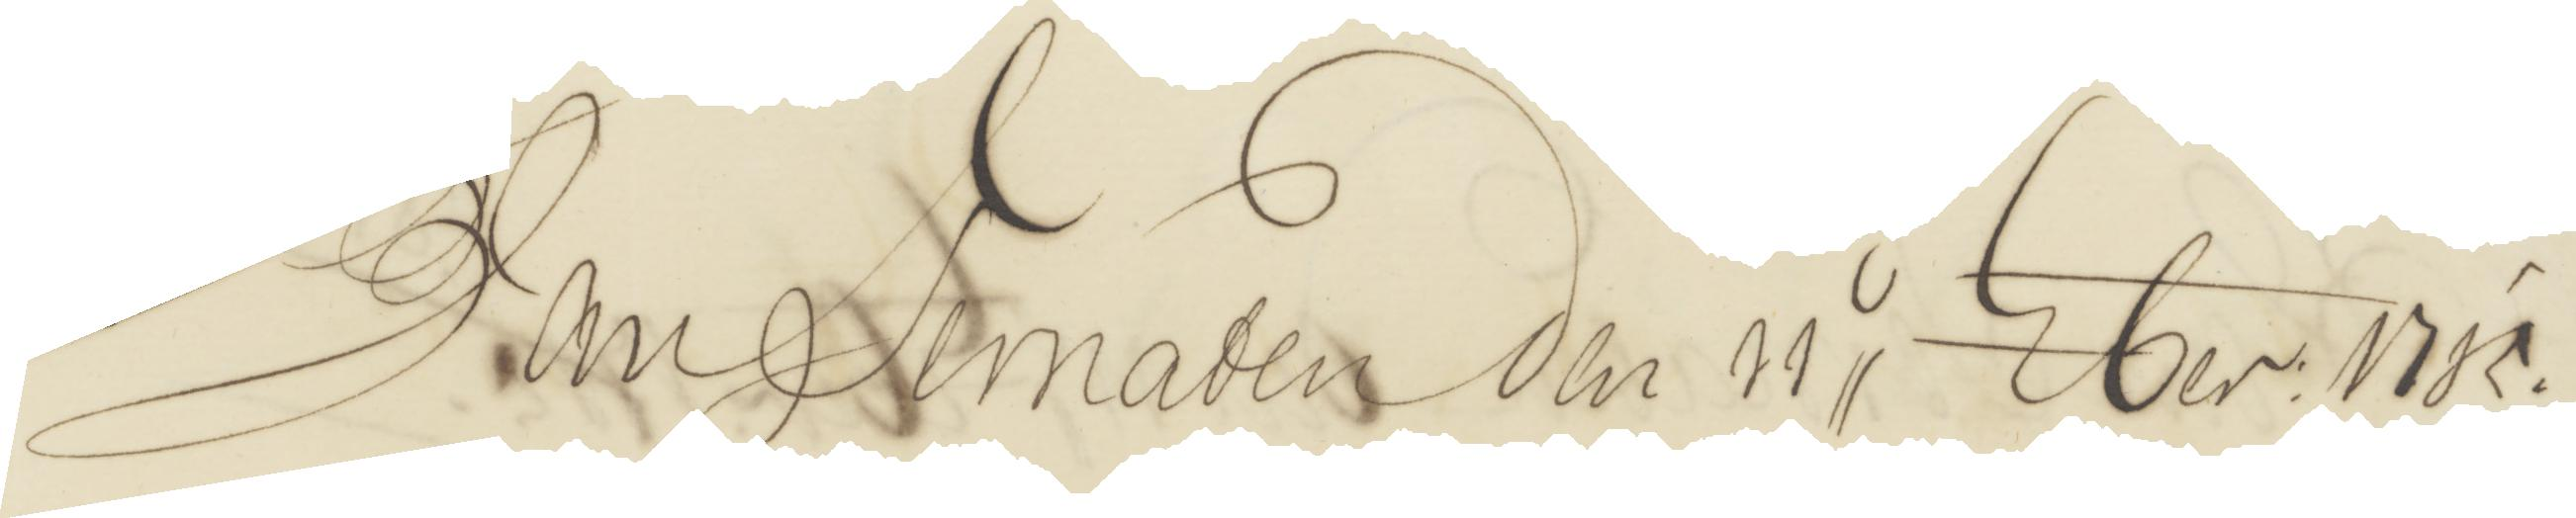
Van Ternaten den 11e' 7ber 1715.
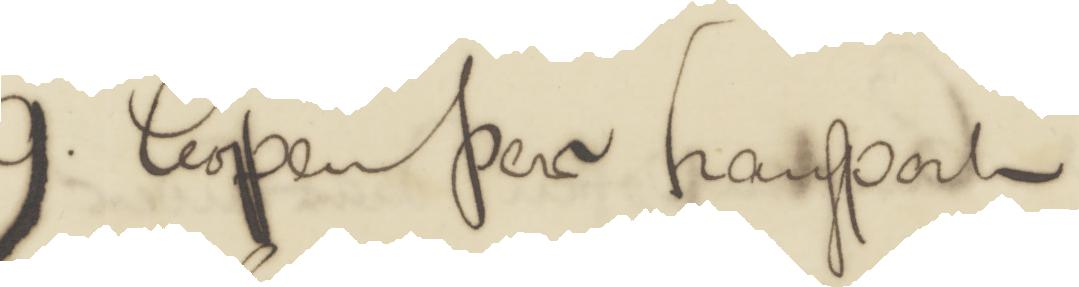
9: koppen per transport
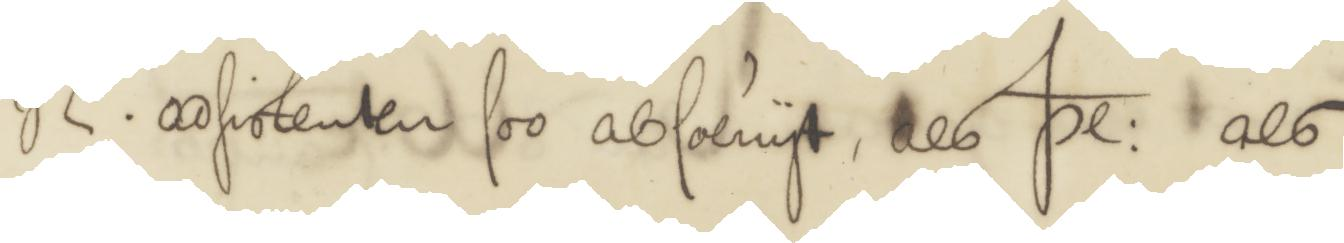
15. adsistenten soo absoluijt, als pl: als
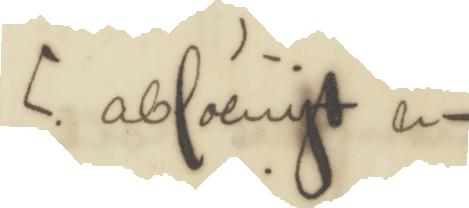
5: absoluijt en
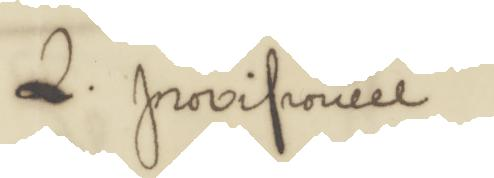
2. provisioneel
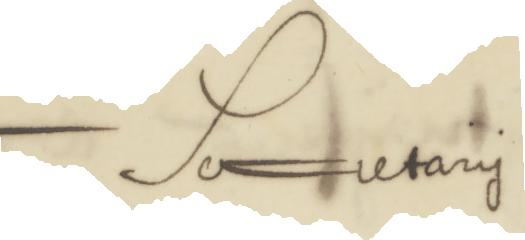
op Secretarij
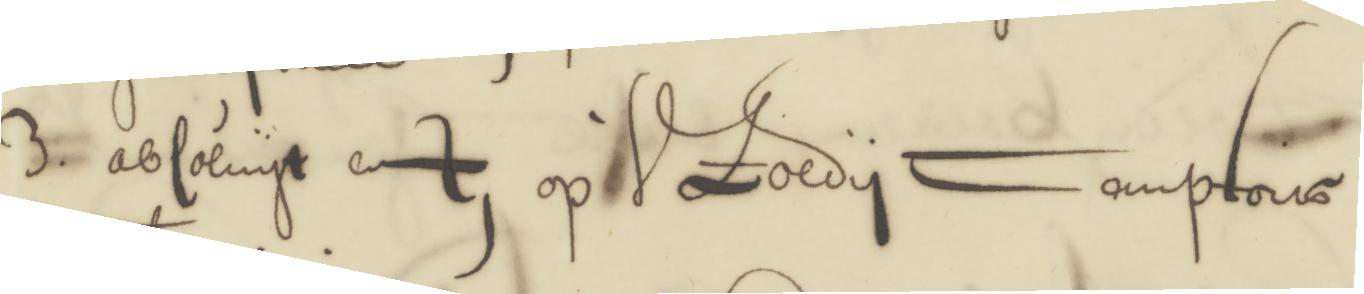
3. absoluijt en, op t Zoldij Comptoir
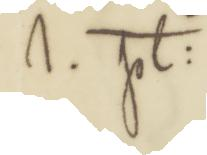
1. pl:
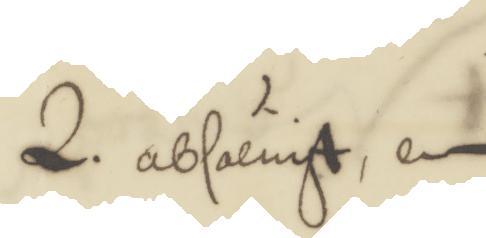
2. absoluijt, en
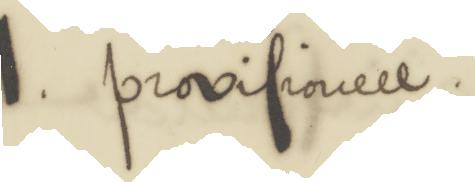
1. provisioneel.
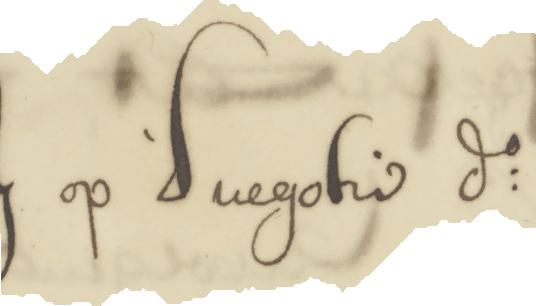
op 't negotie d:o
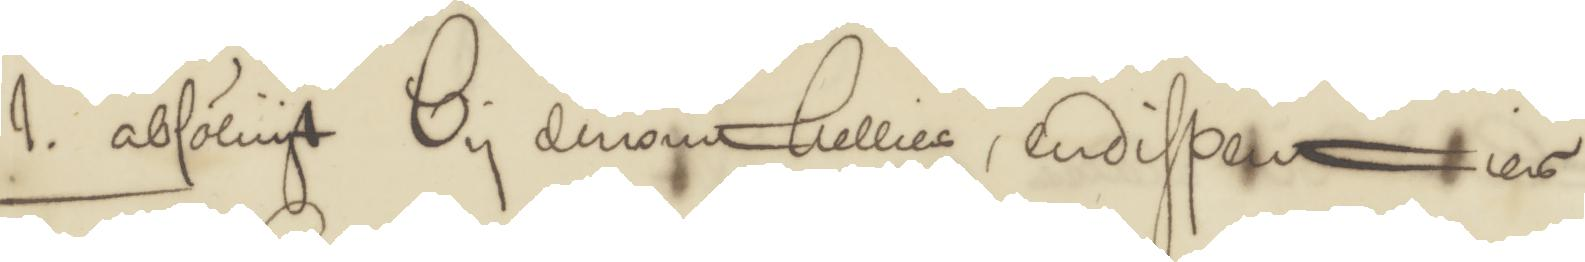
1. absoluijt bij dewinckellier, en dispencier
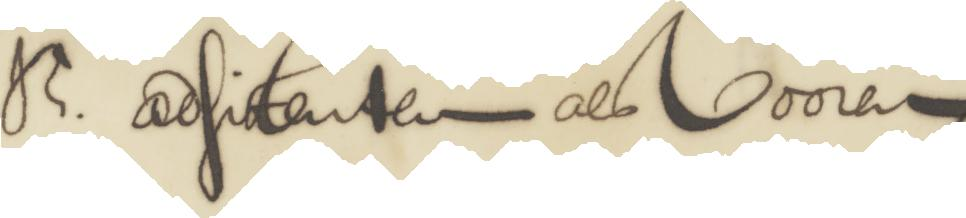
15. adsistenten als vooren
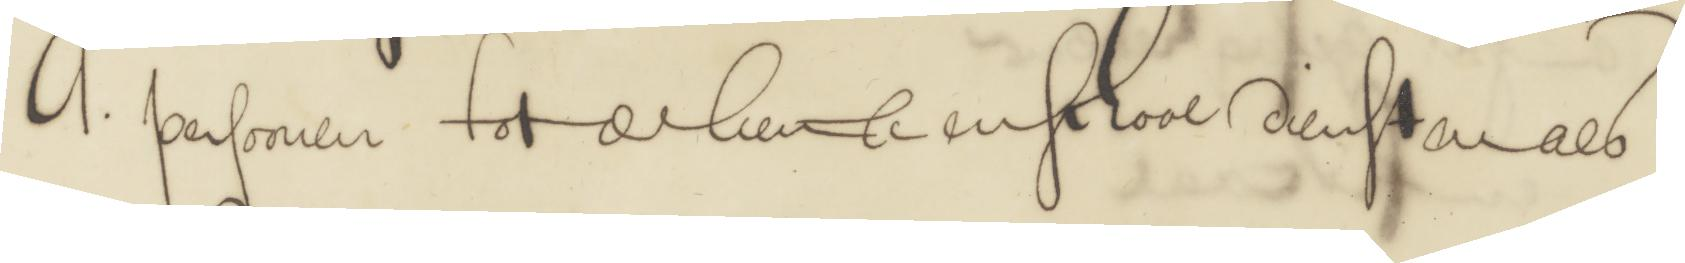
4. persoonen tot de kerck en school dienst en als
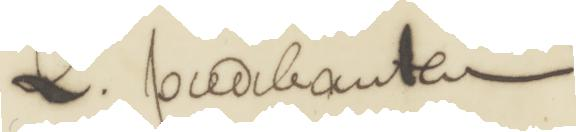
2. predikanten
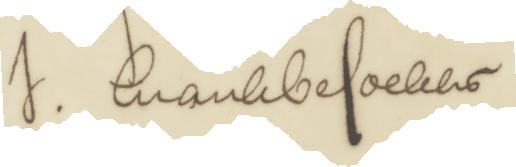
1. krankbesoeker
